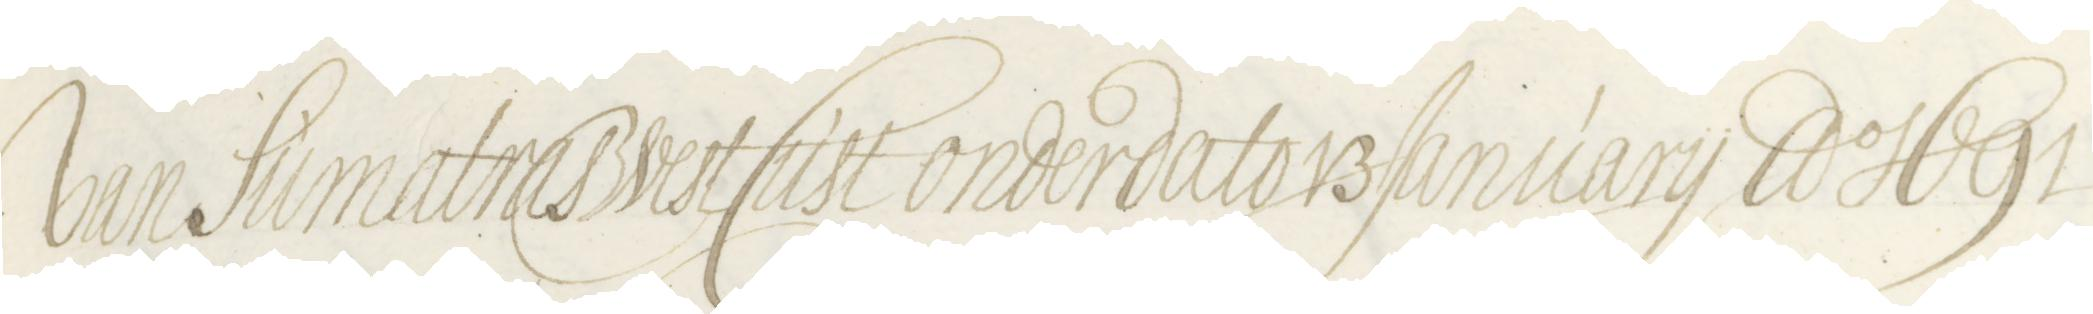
Van Sumatras west Cust onderdato 13 Januarij A:o 1691
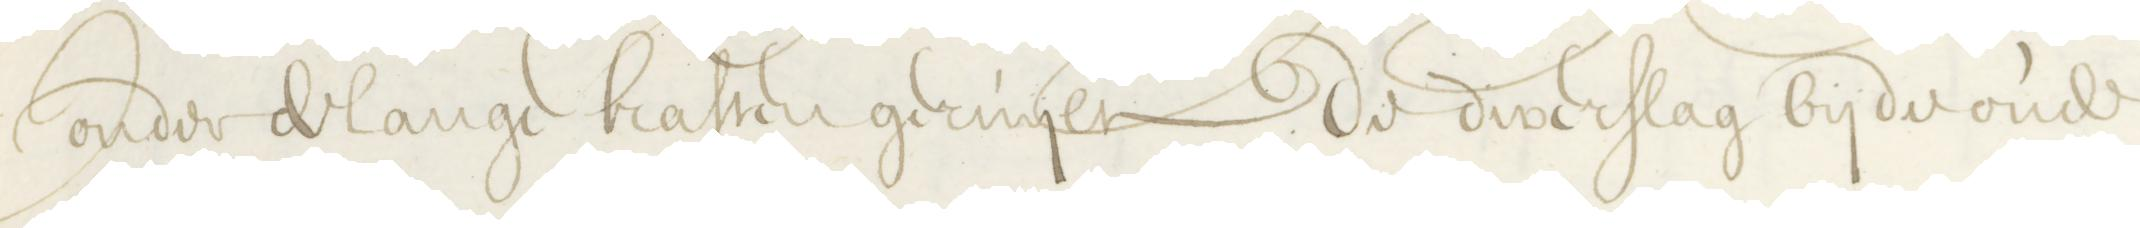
(onder delange kasten geruijlt de diverslag bij de oude
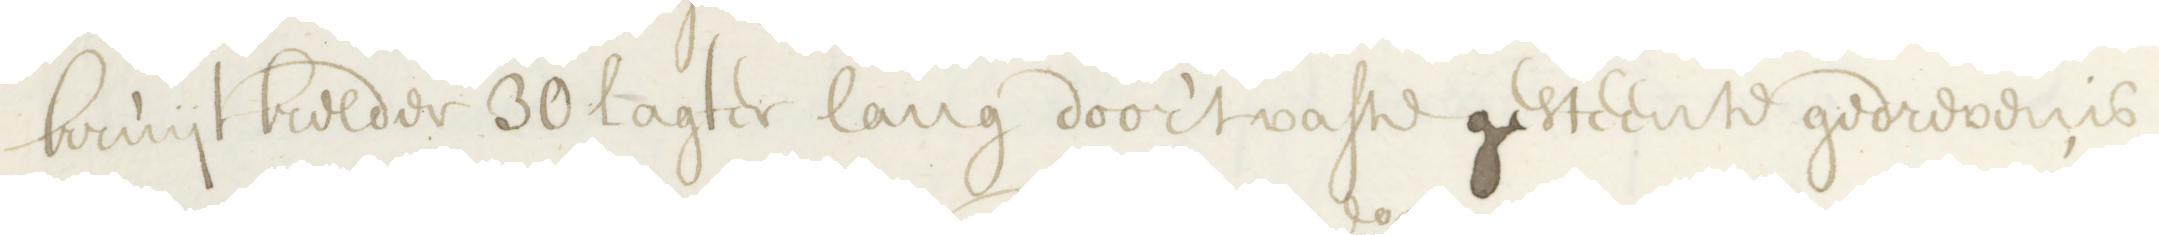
kruijt kelder 30 lagter lang door’t vaste gesteente gedreven is
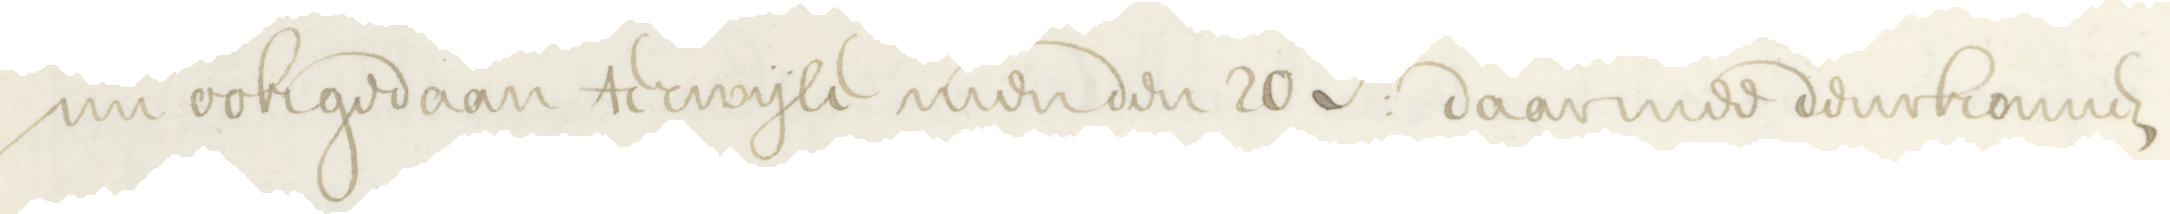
nu ook gedaan terwijle men den 20 d:o daarmee deurkonnen
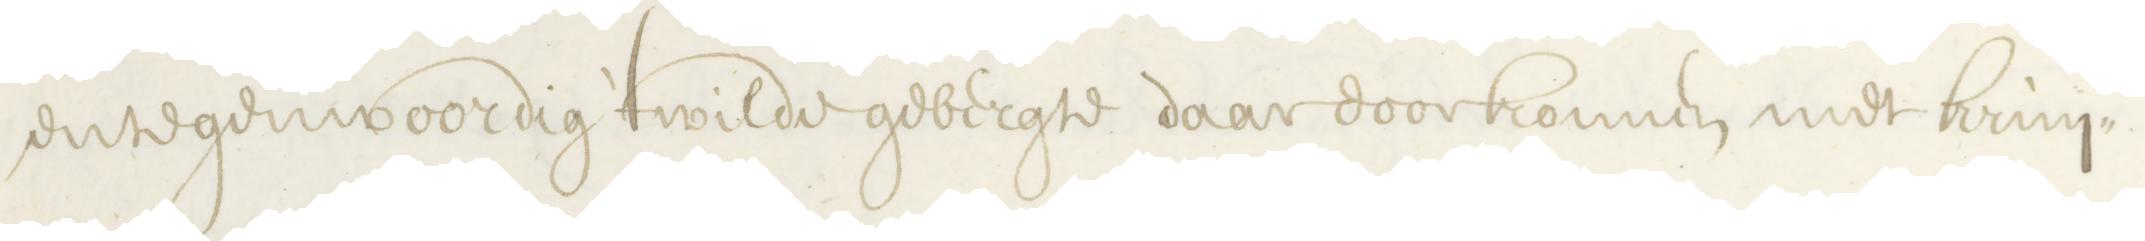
entegenwoordig 'twilde gebergte daar doorkonnen met kruij„
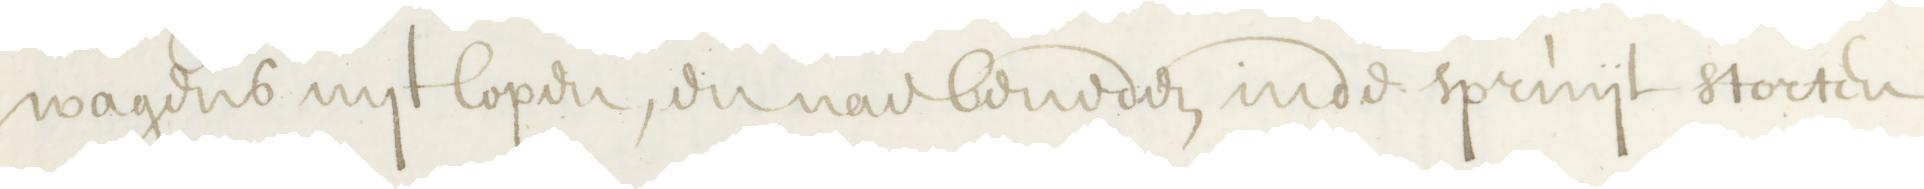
wagens uyt lopen, en nae beneden inde spruijt storten
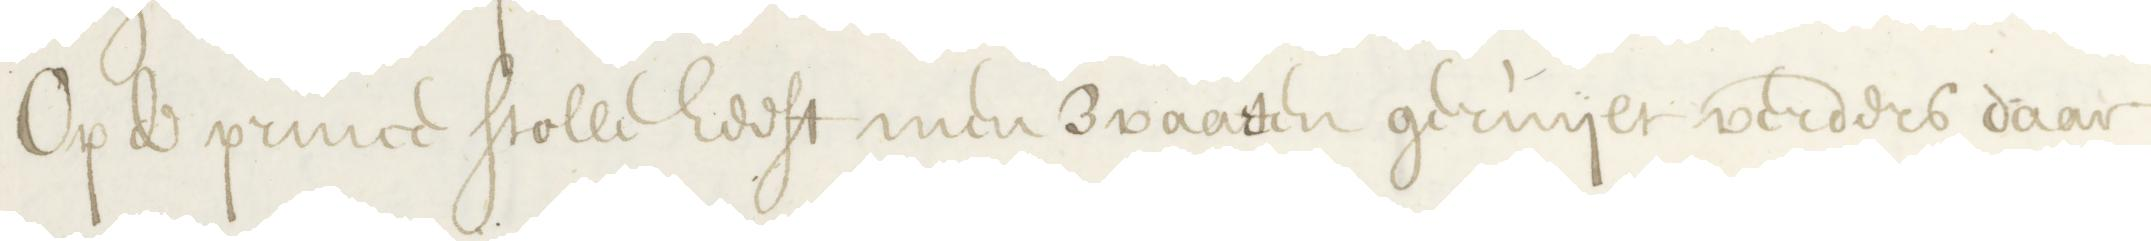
Op de prince stolle heeft men 3 vaarten geruijlt verders daar
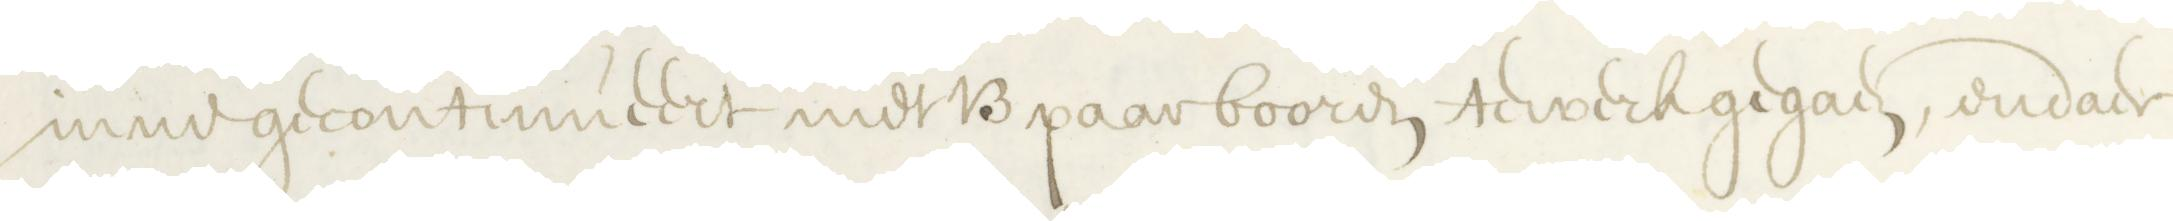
inne gecontinueert met 13 paar booren tewerk gegaen, endaer
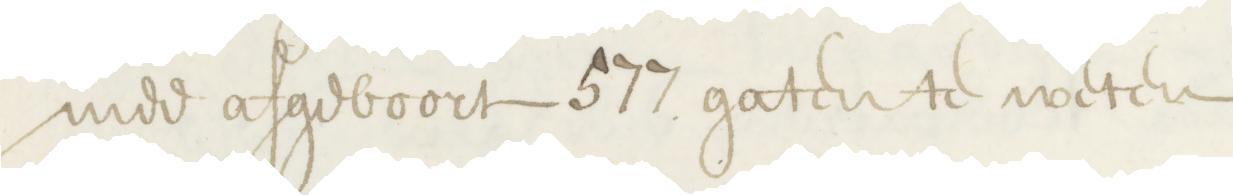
mee afgeboort 577 gaten te weten
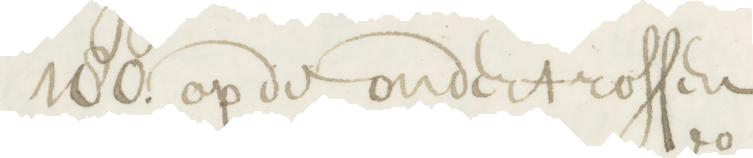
188 op de ondertrossen
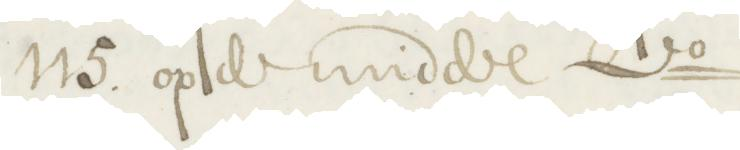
115. op de middel d=o
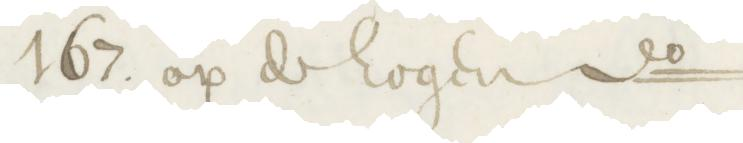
167. op de hogen d=o
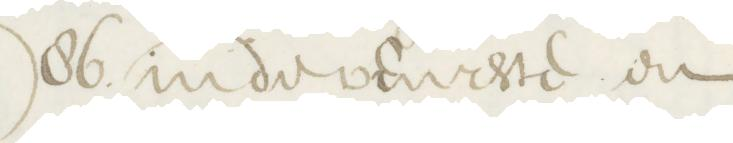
86. in de veurste en
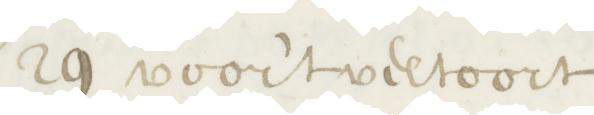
29 voor't veltoort
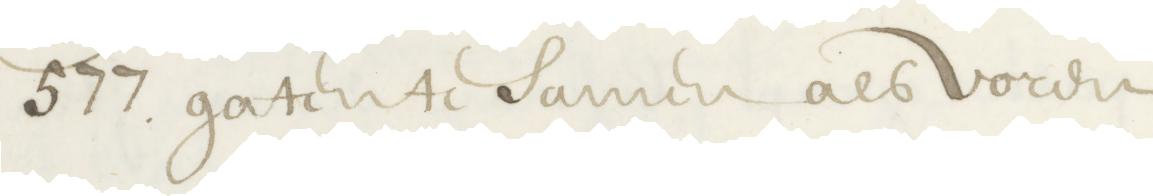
577. gaten te Samen als voren
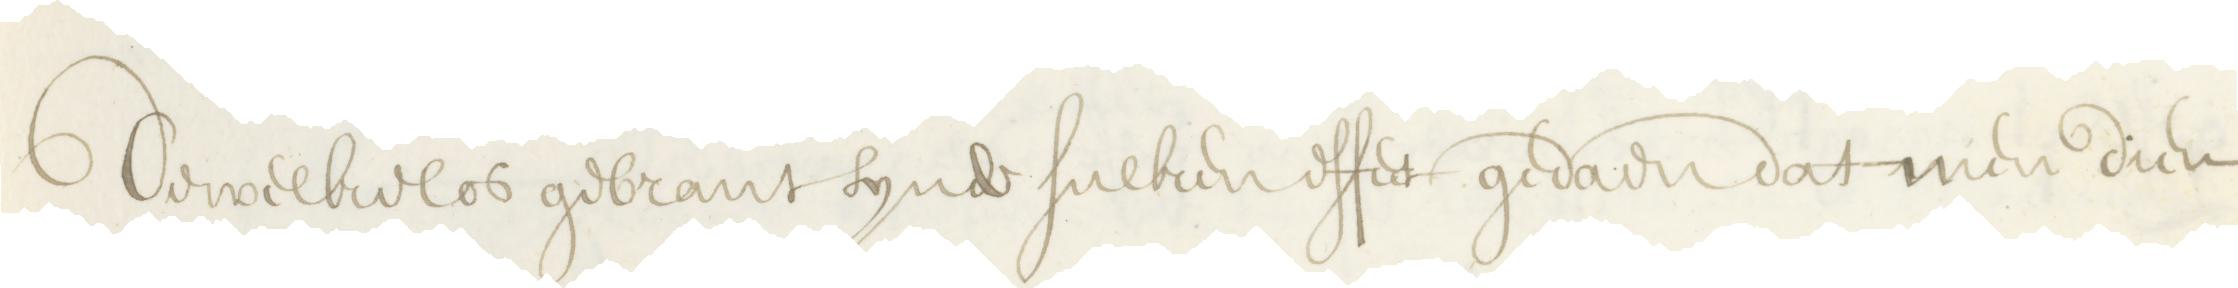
Dewelkelos gebrant synde sulken effect gedaen dat men dien
